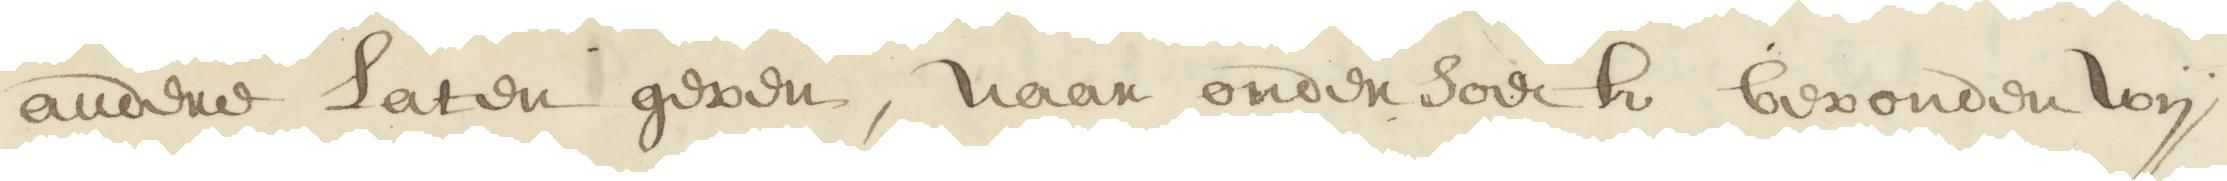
andere laten geven, Naar ondersoeck bevonden Wij
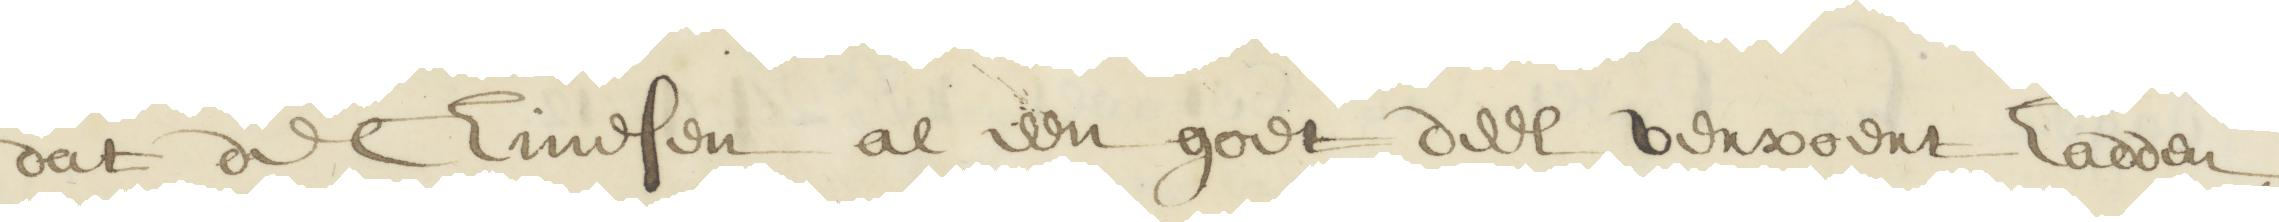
dat de Chinesen al een goet deel vervoert hadden,
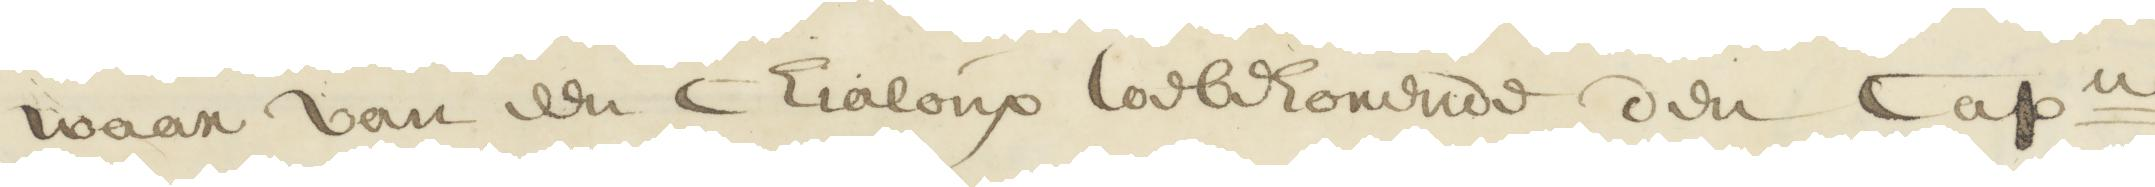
waar van een chialoup toebehorende den Cap=n
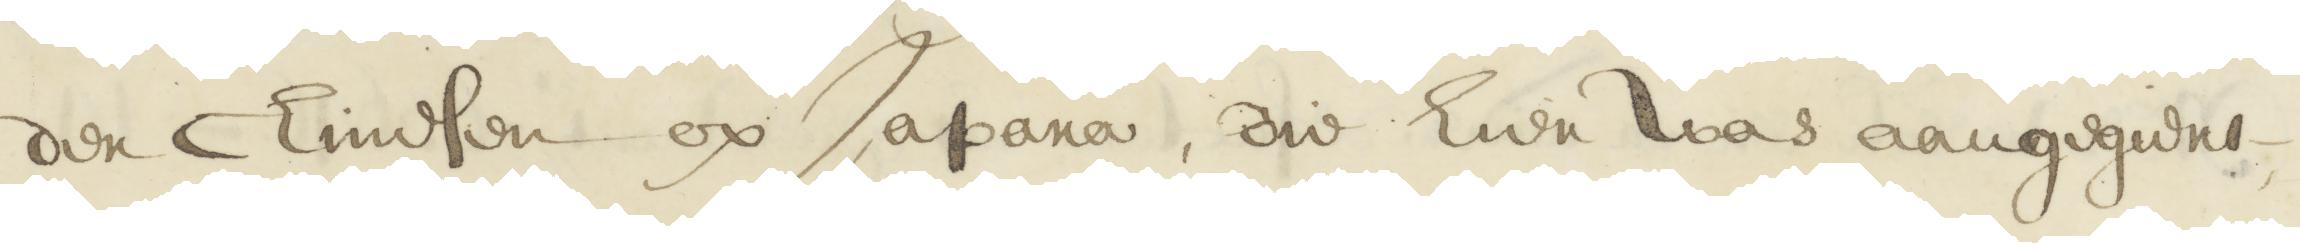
der Chinesen op Japara, die hier Was aangegiert,
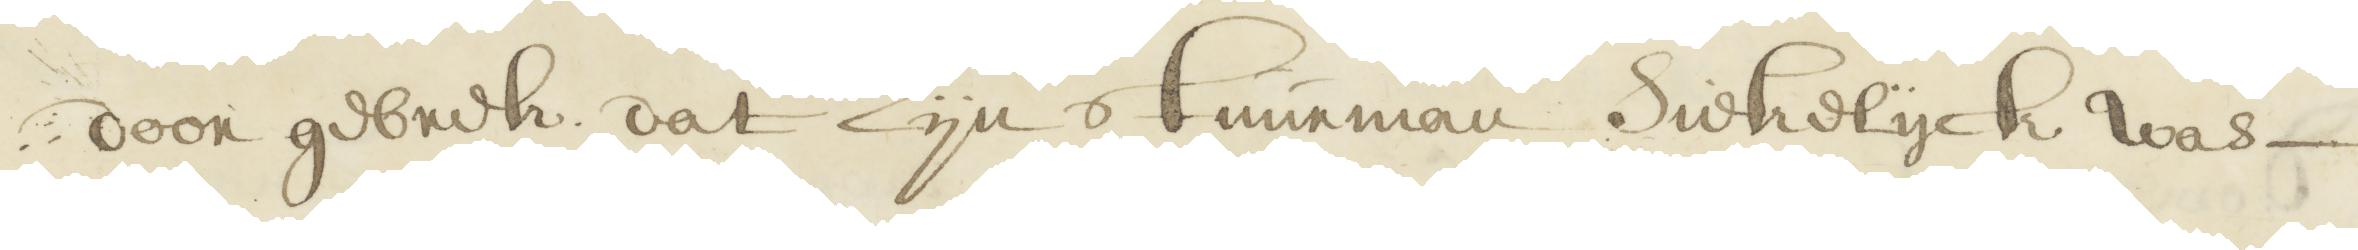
door gebrek dat zijn stuurman siekelijck Was
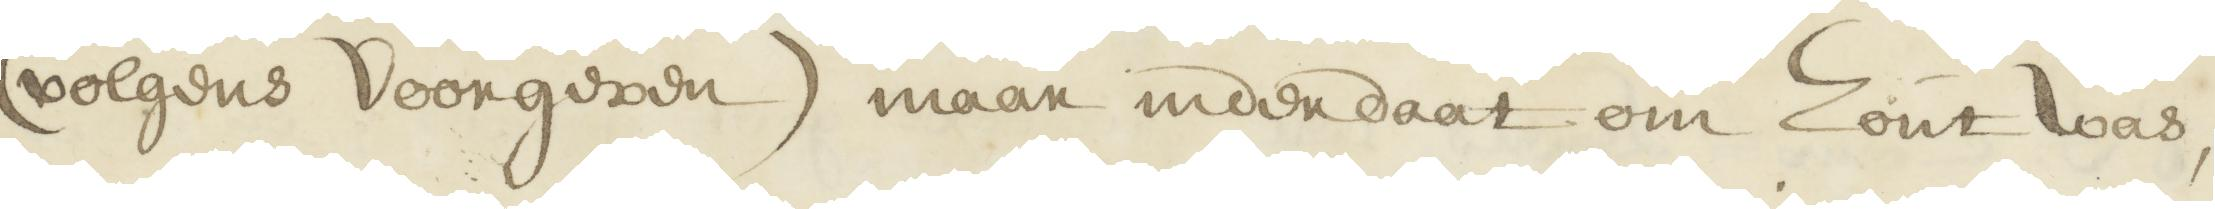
(volgens Voorgeven) maar inderdaat om zout Was,
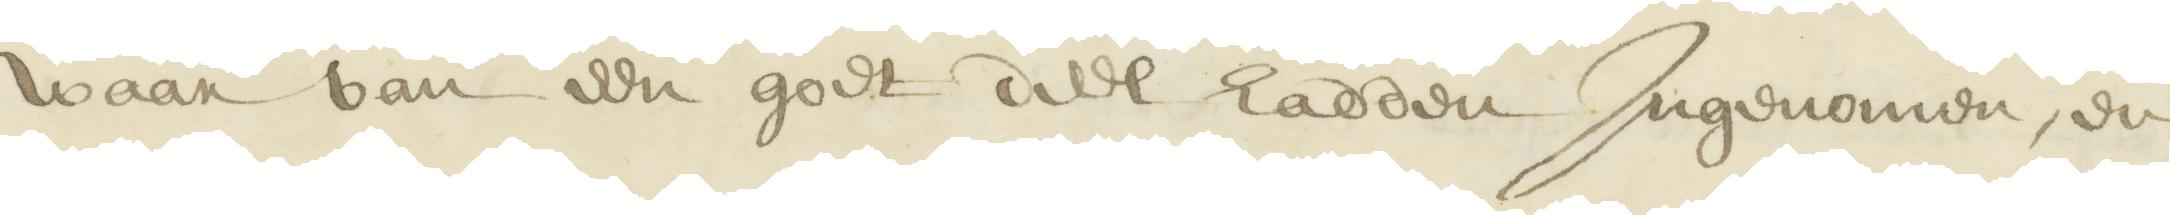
Waar van een goet deel hadden Jngenomen, en
